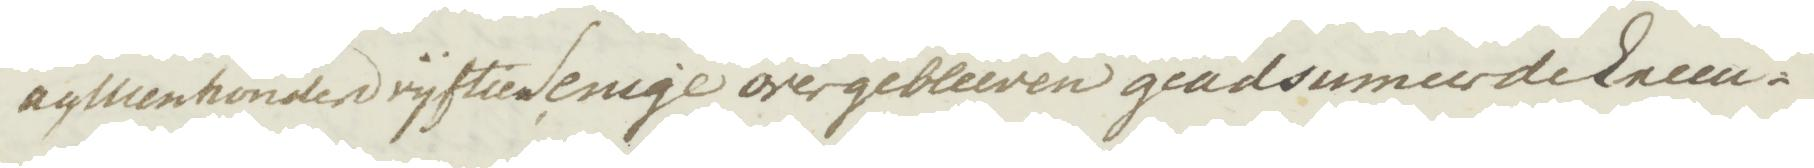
agttienhonderd vijftien,enige overgebleeven geadsumeerde Execu=
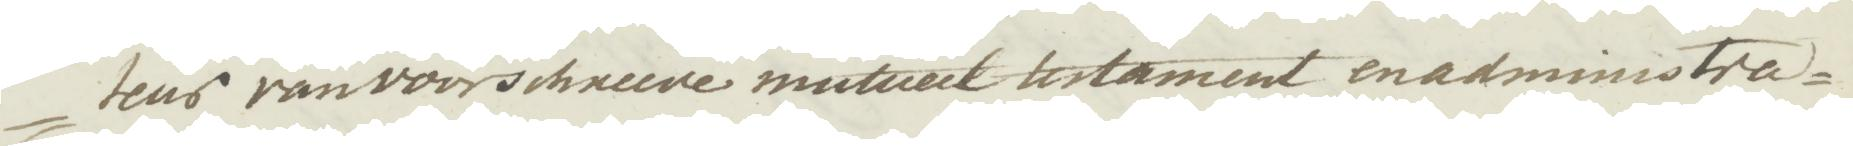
=teur van voorschreeve mutueel testament en administra=
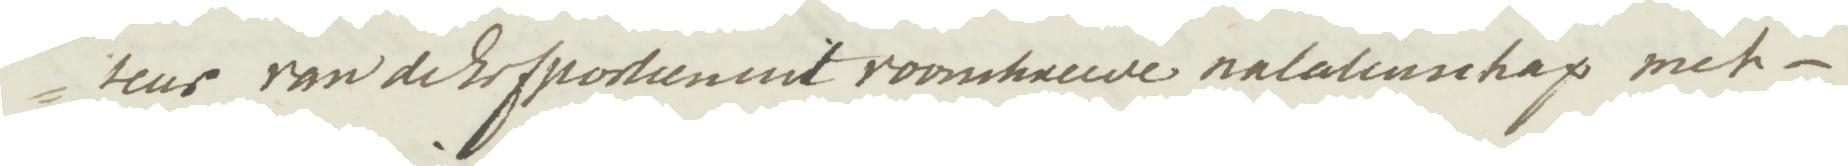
=teur van de Erfportien uit voorschreeve nalatenschap met —
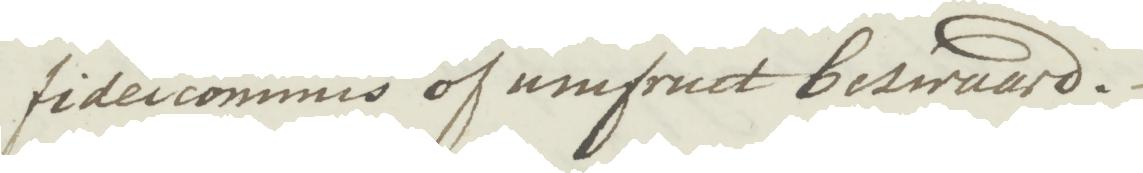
fidei commis of usufruct beswaard.
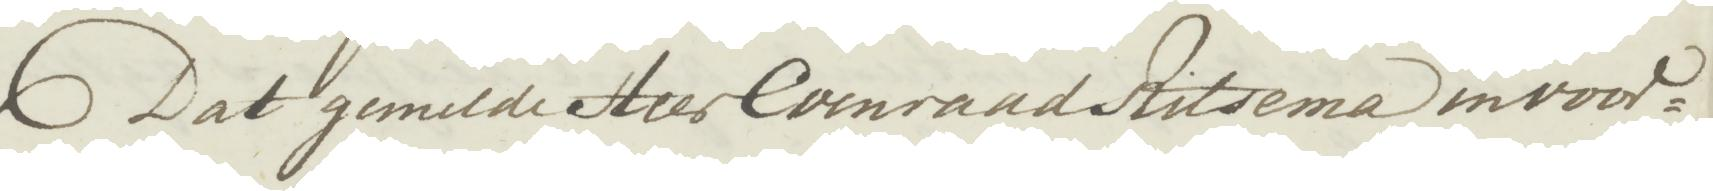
Dat gemelde Heer Coenraad Ritsema in voor=
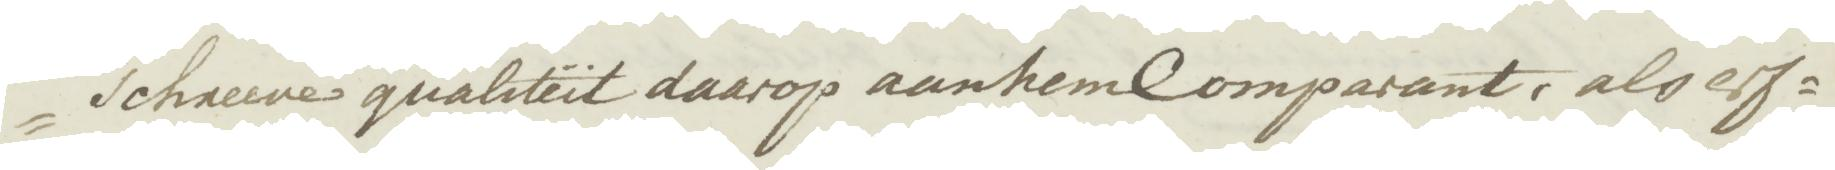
=schreeve qualiteit daar op aan hem Comparant, als erf=
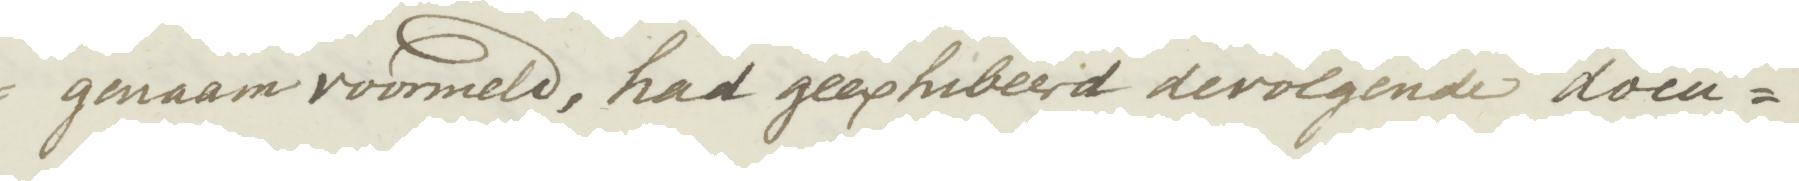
genaam voormeld, had geexhibeerd devolgende docu =
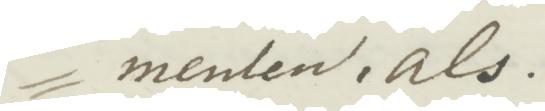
= menten, als.
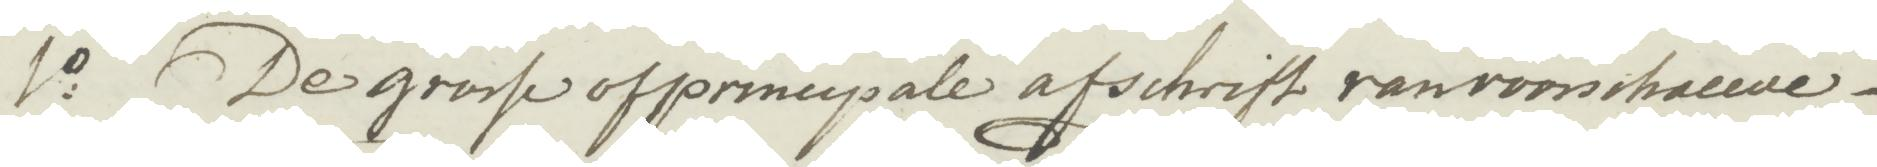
1:o De grosse of principale afschrift van voorschreeve -
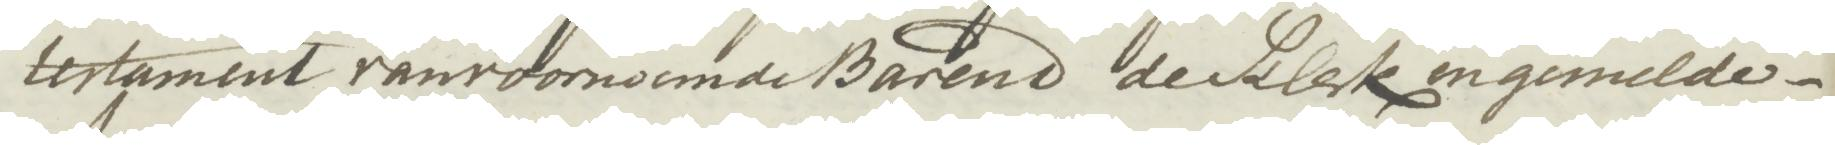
testament van voornoemde Barend de Klerk en gemelde -
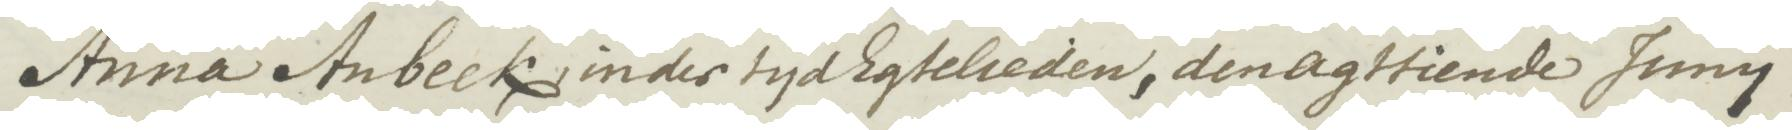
Anna Anbeek, in der tijd Egtelieden, den agttiende Juny
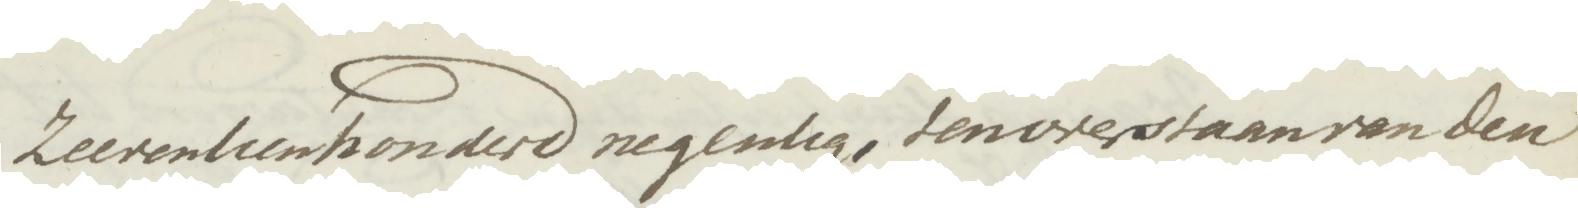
Zeeventienhonderd negentig, ten overstaan van den
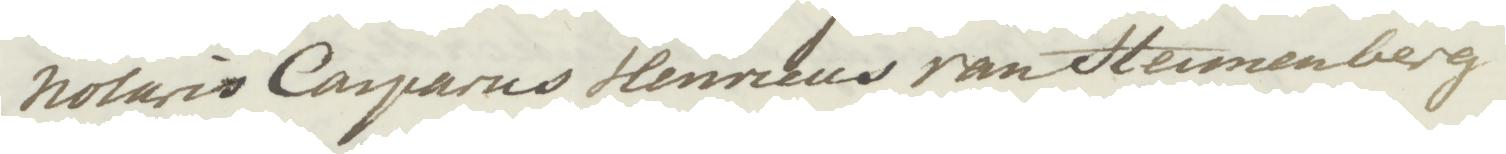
notaris Casparus Henricus van Heimenberg
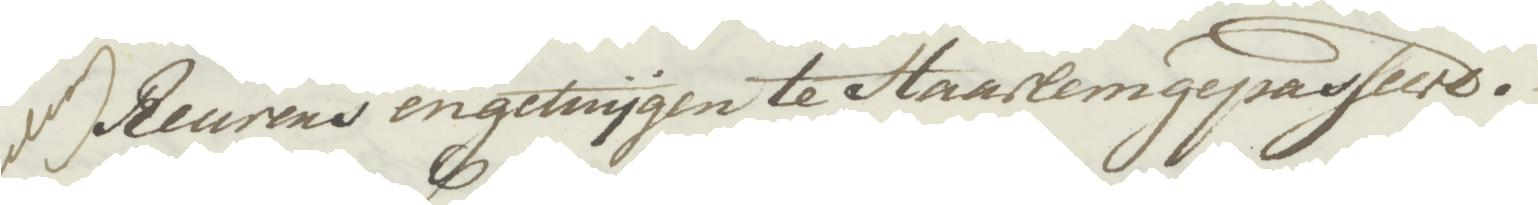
Reuvens en getuijgen te Haarlem gepasseerd.
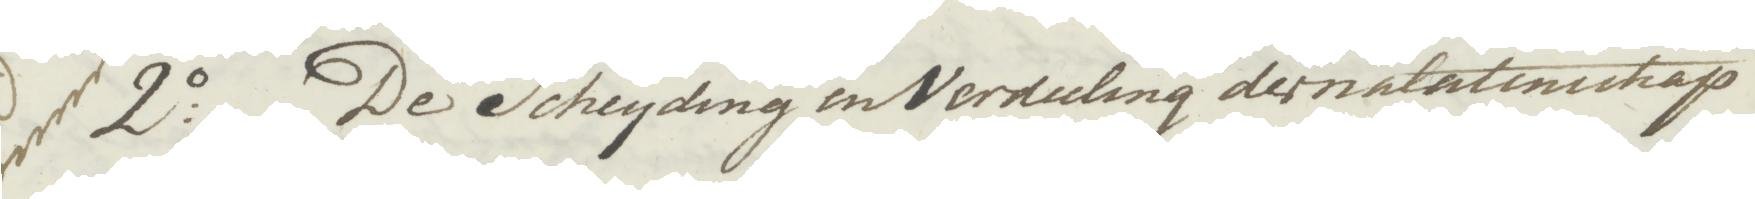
2:o De Scheyding en Verdeeling der nalatenschap
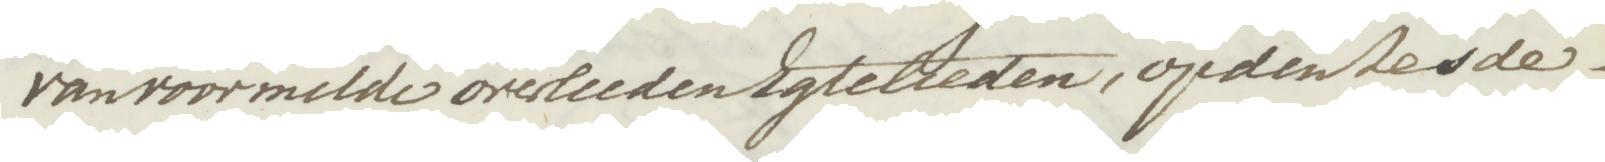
van voormelde overleeden Egtelieden, op den Zesde
